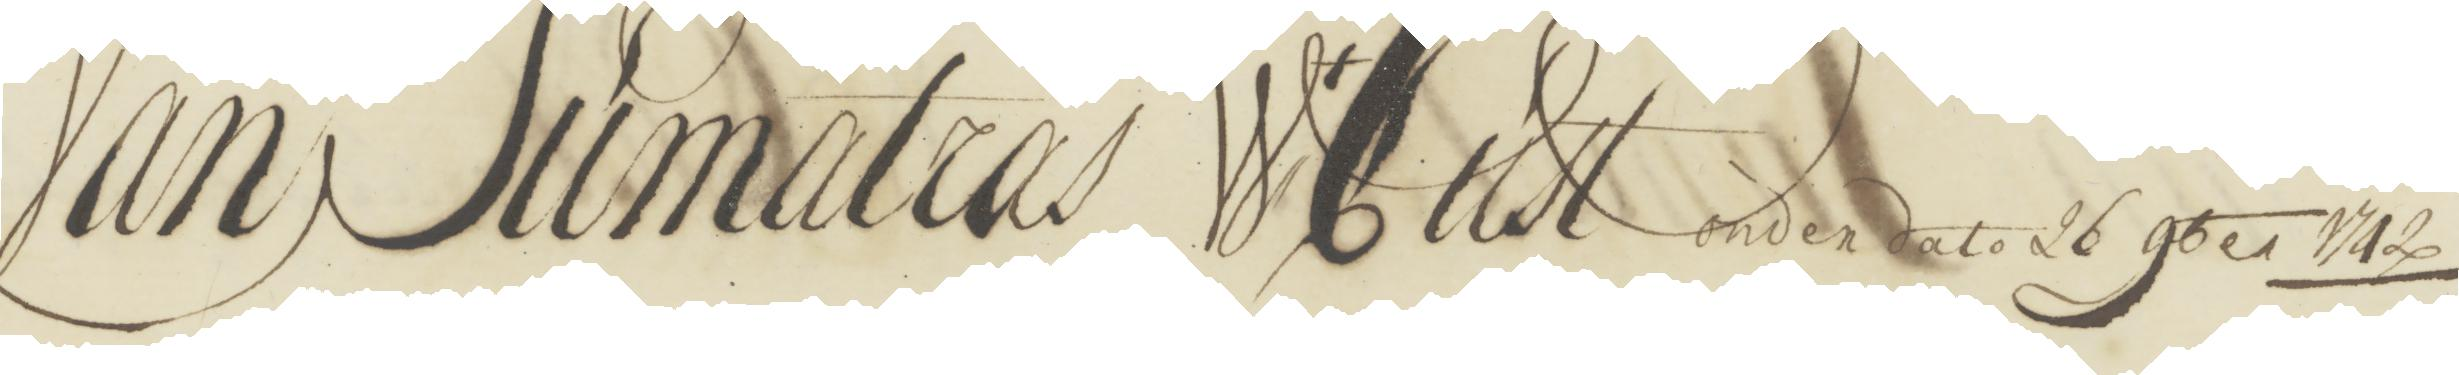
Van Sumatras W„t Cust onder dato 26 9ber 1742.
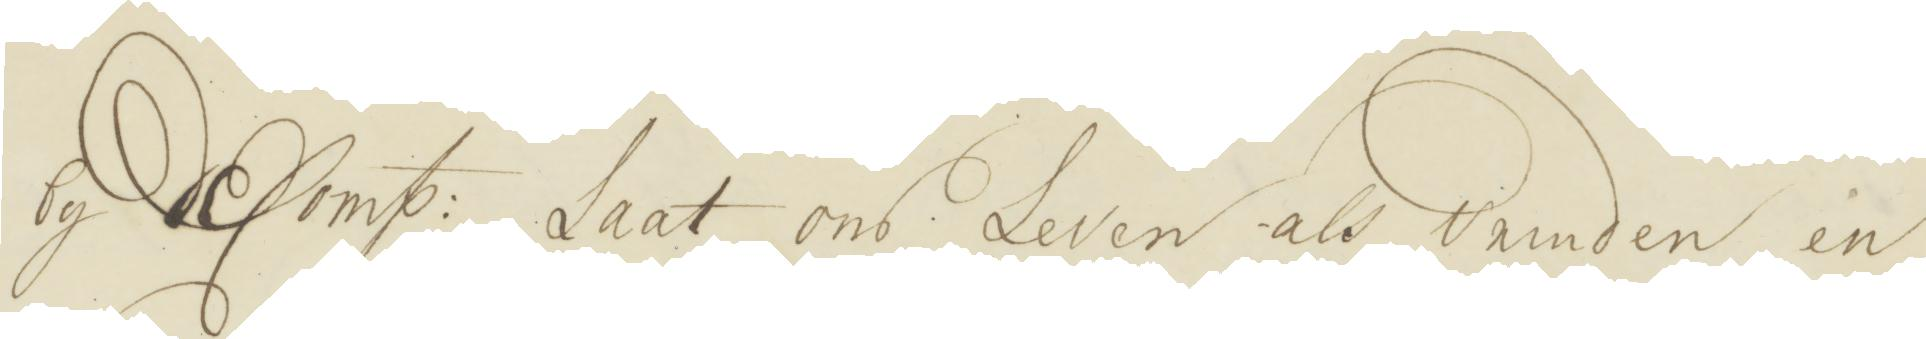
by d E Comp: Laat ons Leven als vrinden en
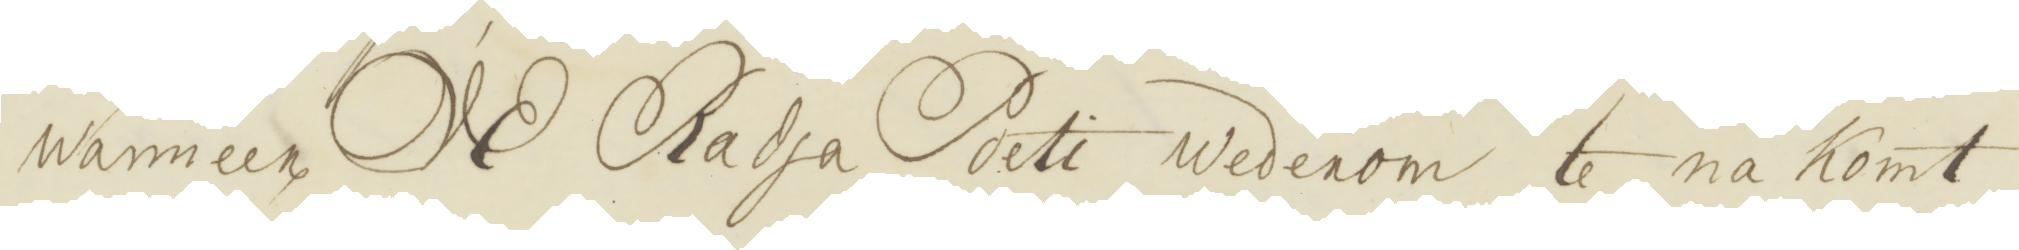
wanneer UE Radja Poeti wederom te na komt
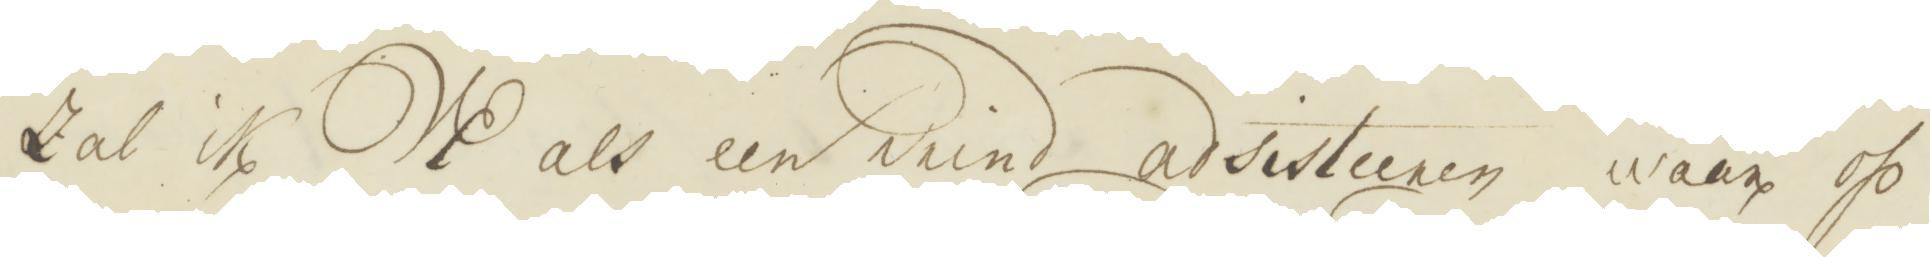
zal ik UE als een vrind adsisteeren waar op
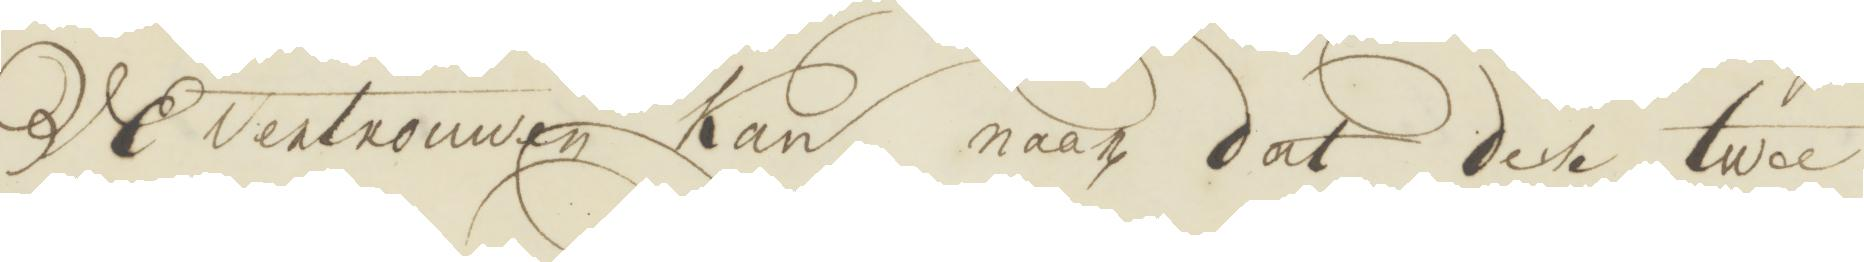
UE vertrouwen kan, naar dat dese twee
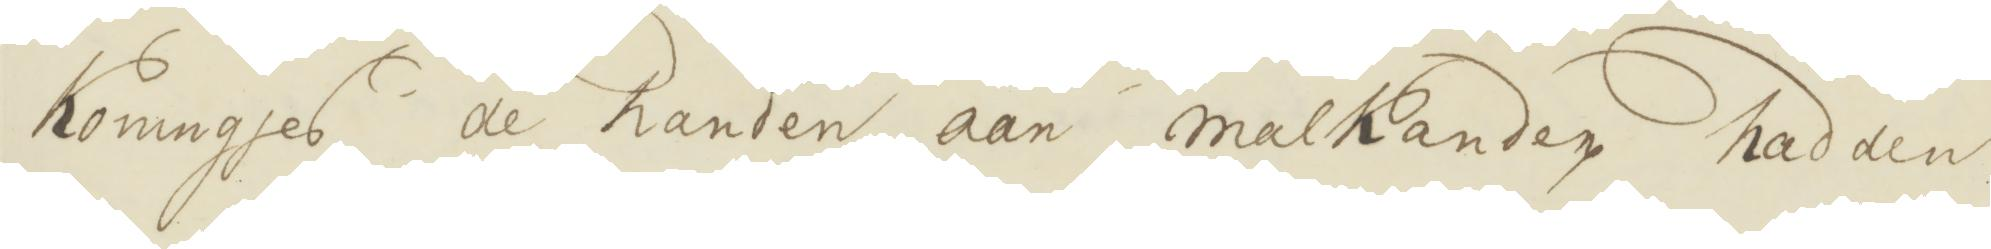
koningjes de handen aan malkander hadden
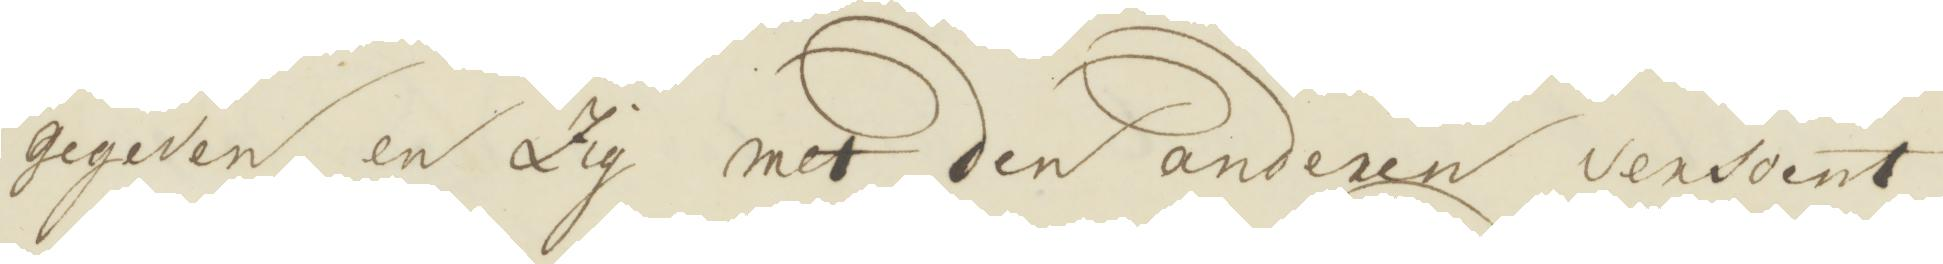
gegeven, en zig met den anderen versoent
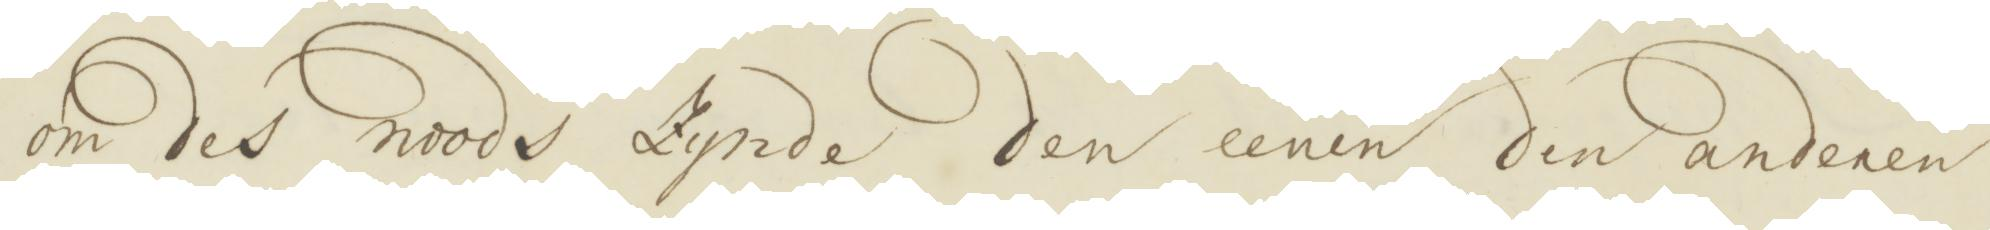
om des nods zynde den eenen den anderen
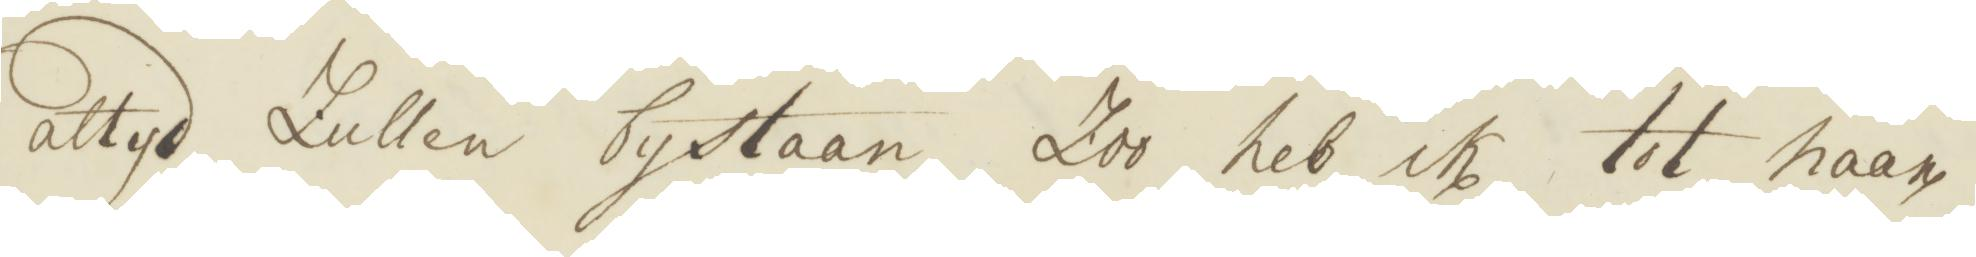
altyd zullen bystaan, zoo heb ik tot naar,
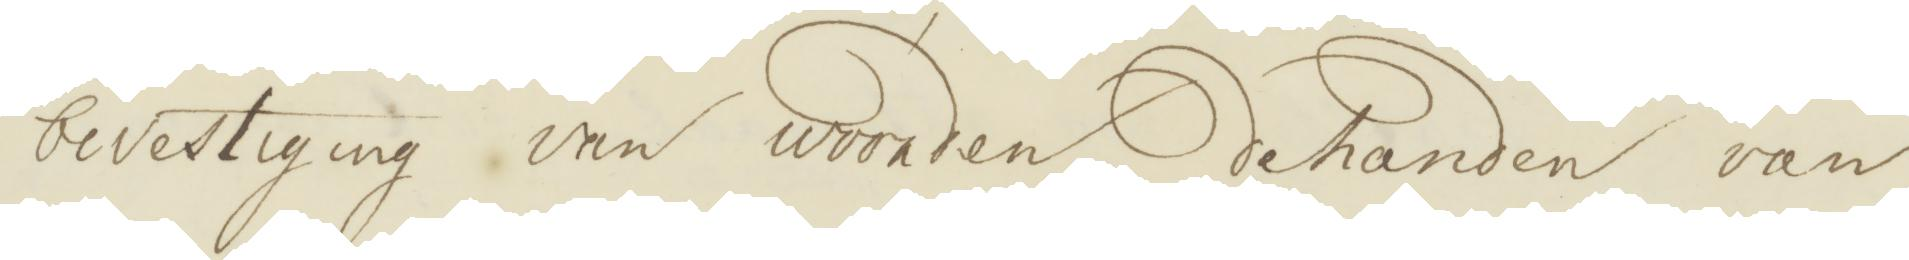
bevestiging van woorden, de handen van
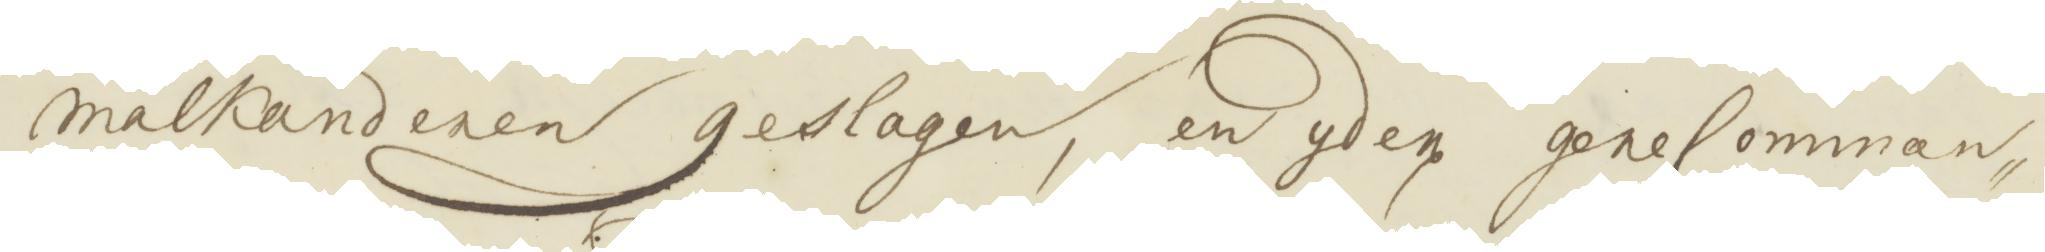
malkanderen geslagen, en yder, gerecomman„
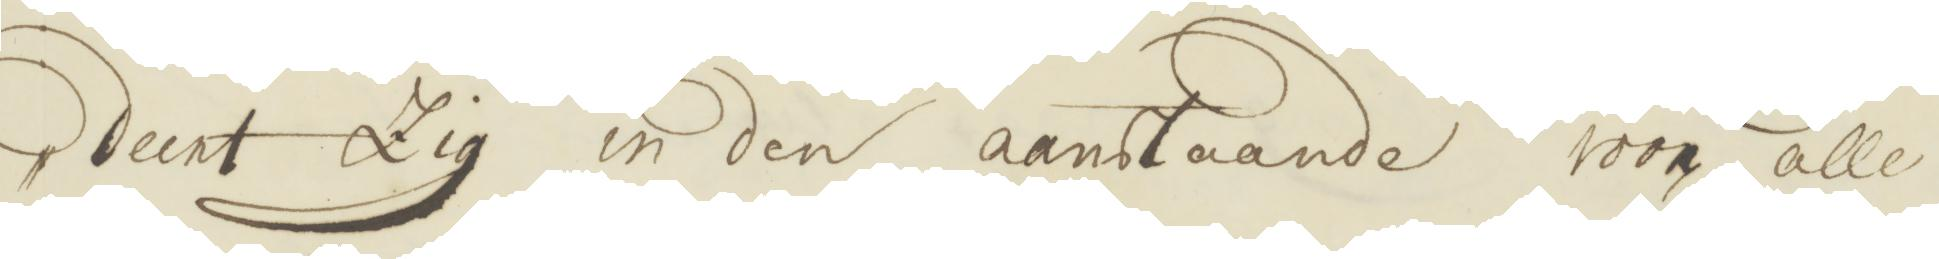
„deert zig in den aanstaande voor alle
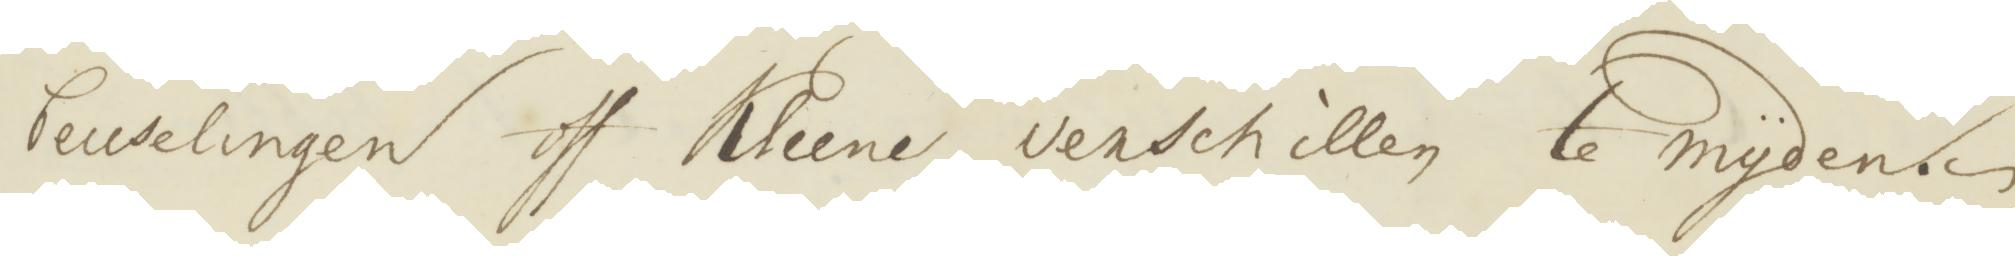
beuselingen off Kleene verschillen te mijdens.
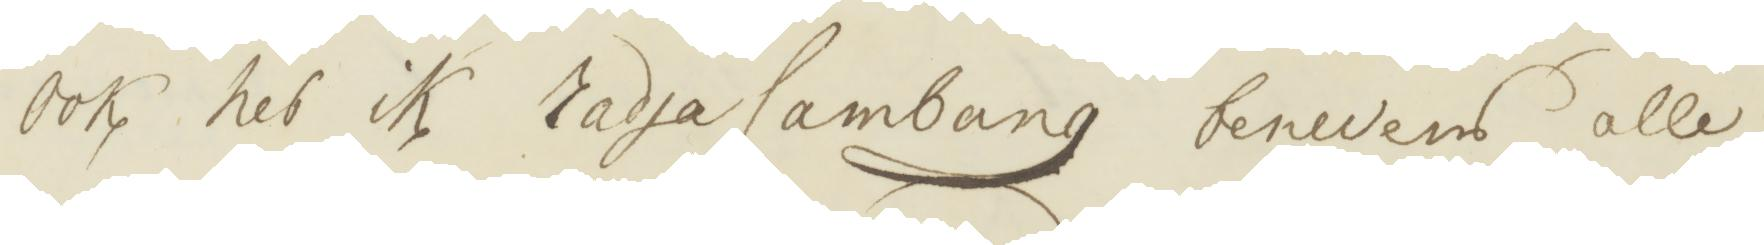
Ook heb ik radja Cambang benevens alle
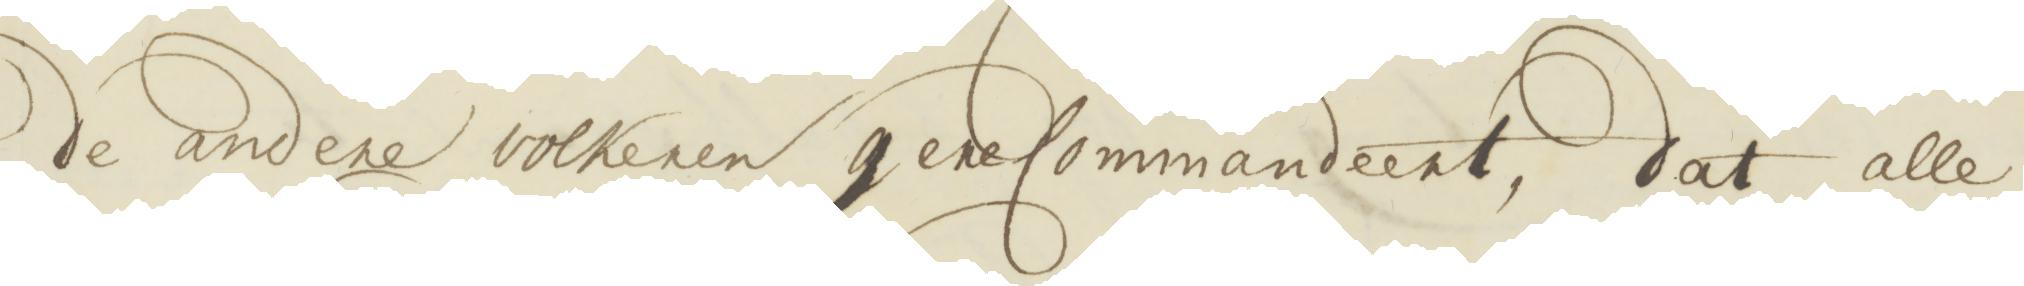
de andere volkeren gerecommandeert, dat alle
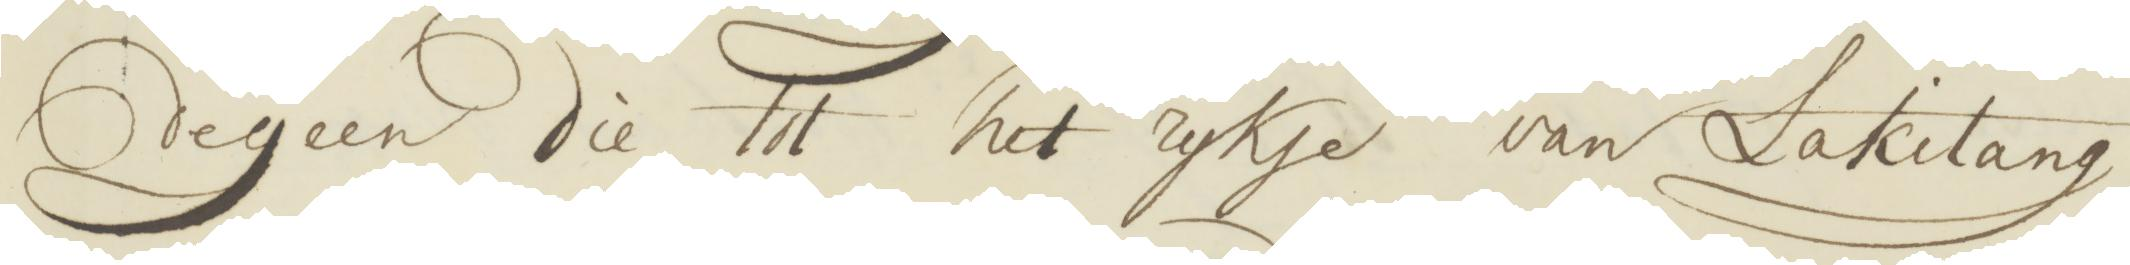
degeen die tot het rykje van Sakitang
